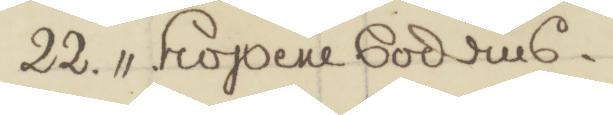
22. „ kopere bodems .
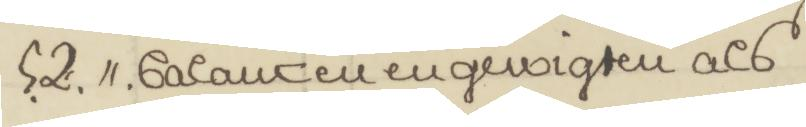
52. „. balancen en gewigten als
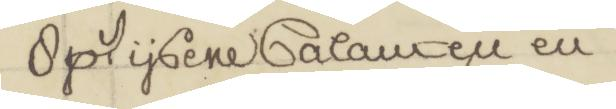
8 p:s ijsere balancen en
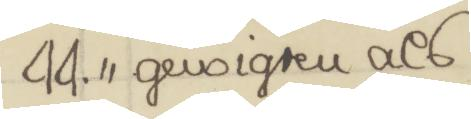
44. „ gewigten als
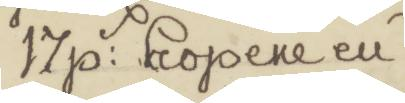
17 p:s kopere en
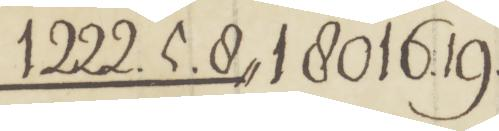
1222.5.8„18016.19
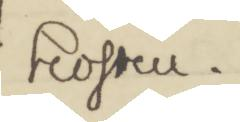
kosten .
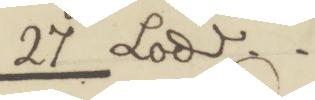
27 Lode . .
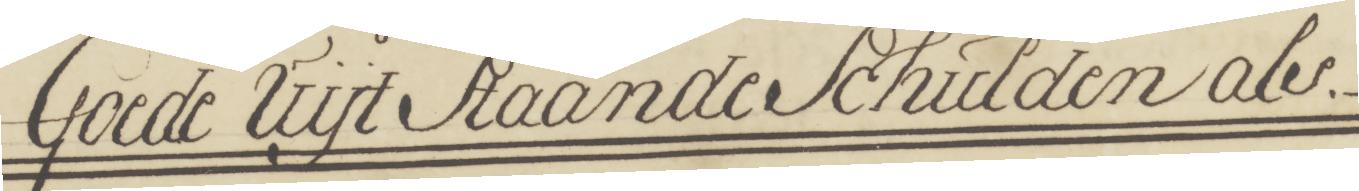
Goede uijt Staande Schulden als.
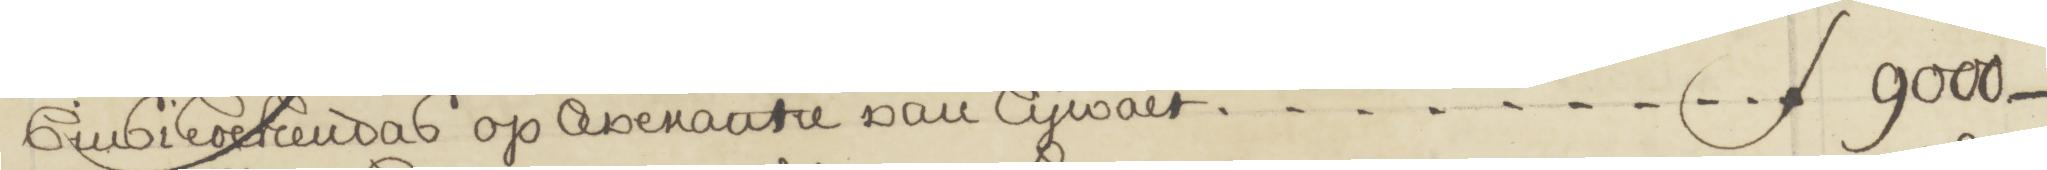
binsihoekendas op leverantie van lijwaet - - - - - - - - - ƒ 9000.—
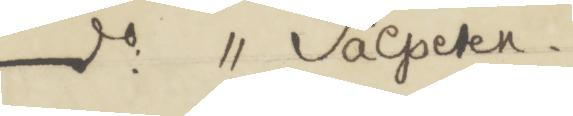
_:o „ Salpeter .
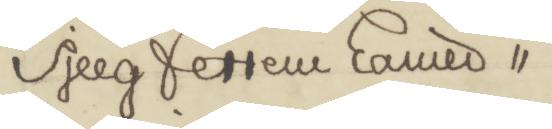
Sjeeg fettem hamed „
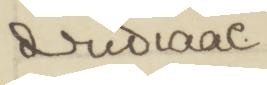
dendiaal
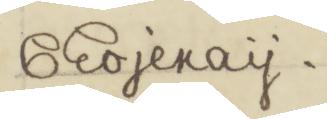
bhojeraij
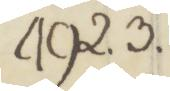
492.3.8.
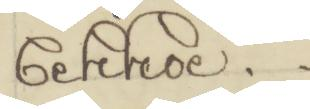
bekkoe .
